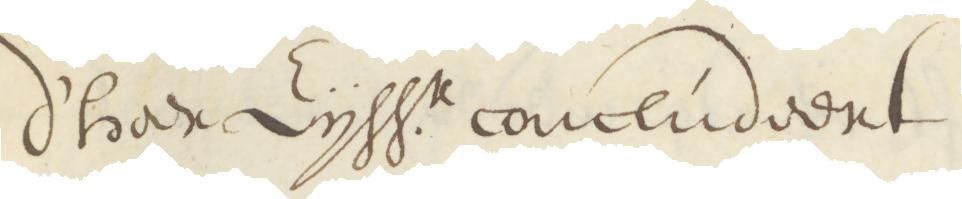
d’ heer Eijss.r concludeert
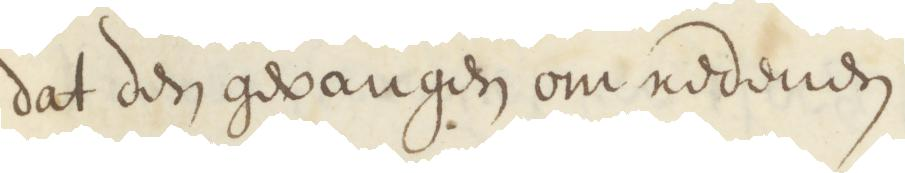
dat den gevangen om redenen
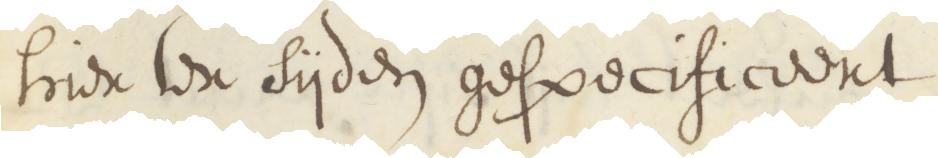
hier ter sijden gespecificeert
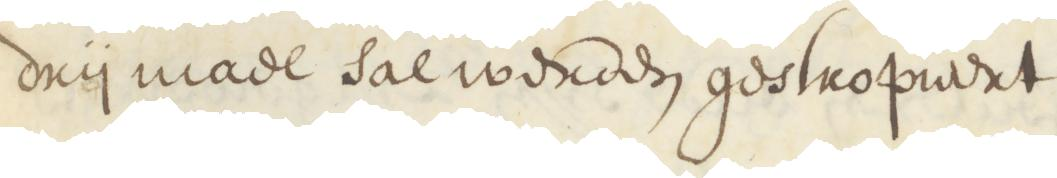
drij mael sal werden gestropieert
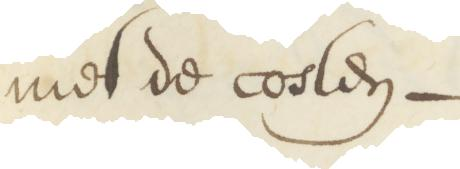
met de costen —
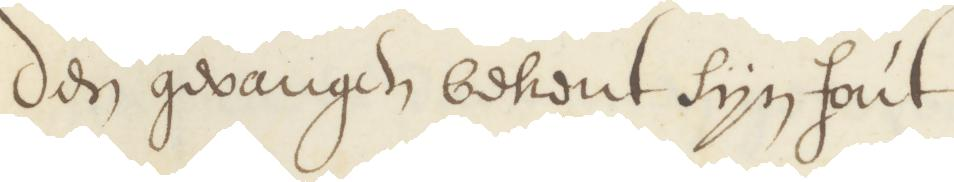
den gevangen bekent sijn fout
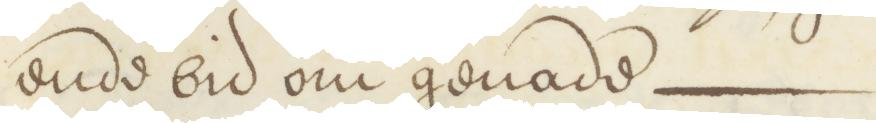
ende bid om genade —
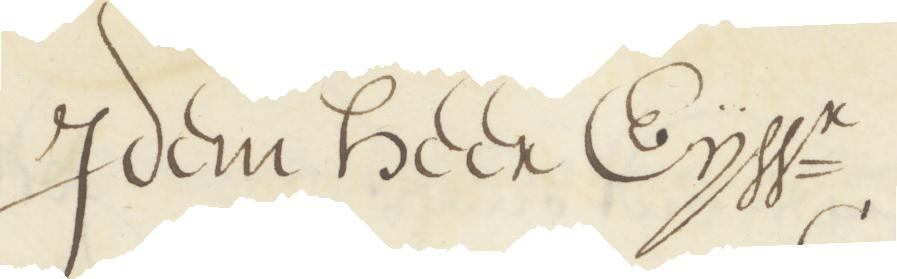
Idem Heer Eijss=r
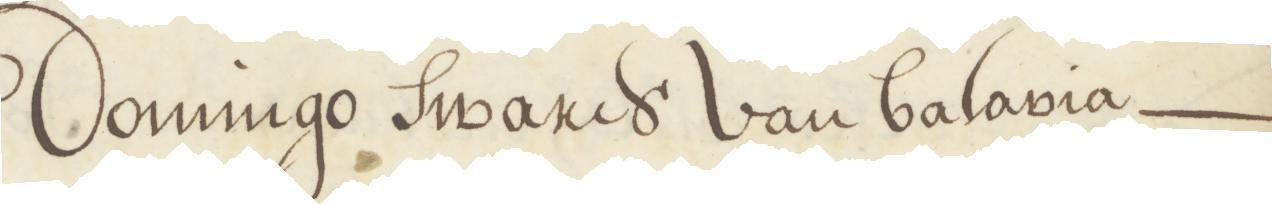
Domingo Swares van batavia —
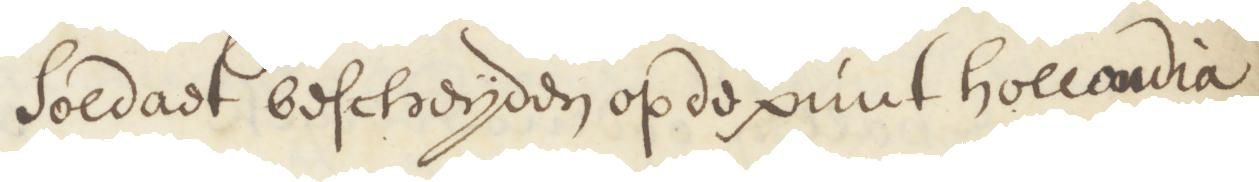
soldaet bescheijden op de punt hollandia
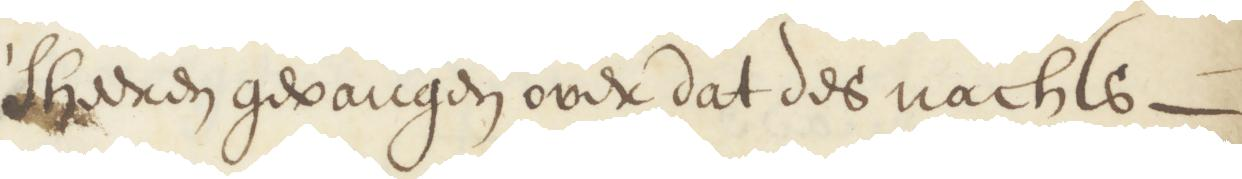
's heeren gevangen over dat des nachts —
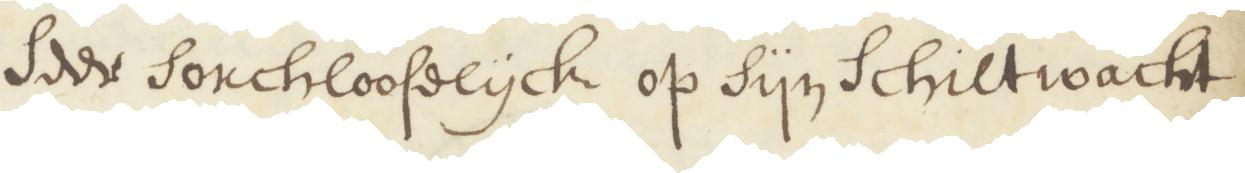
seer sorchlooselijck op sijn schiltwacht
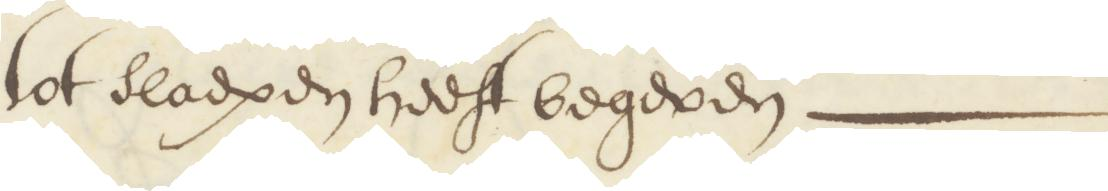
tot slaepen heeft begeven —
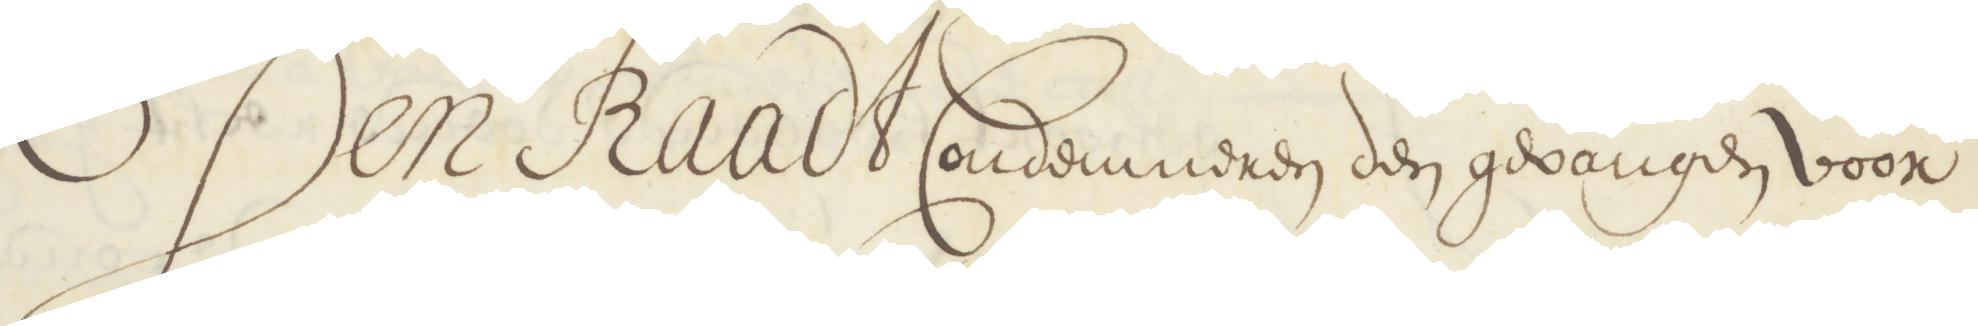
Den Raadt Condemneren den gevangen voor
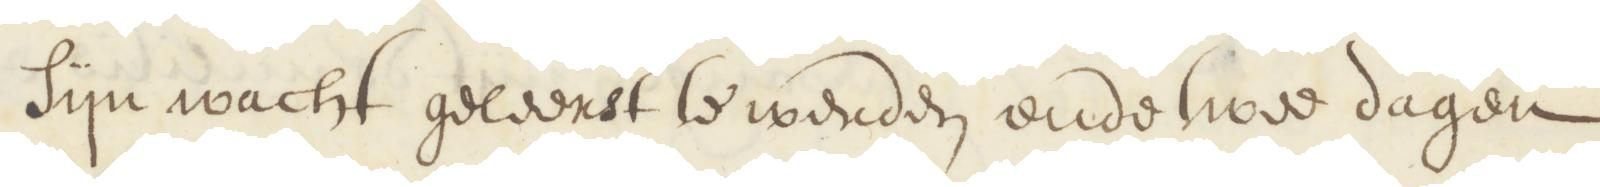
Sijn wacht geleerst te werden ende twee dagen
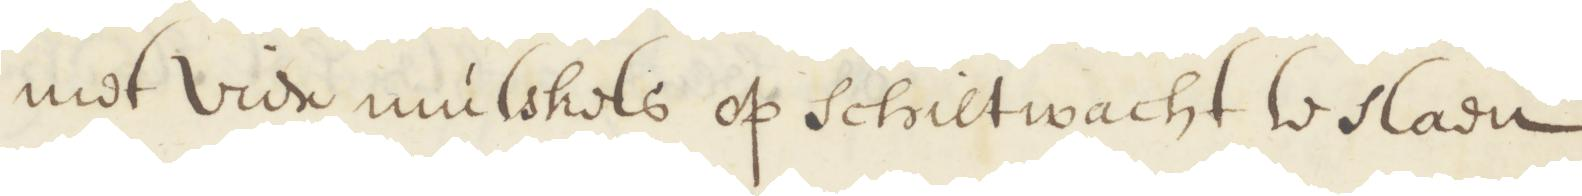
met vier mutskets op schiltwacht te staen
